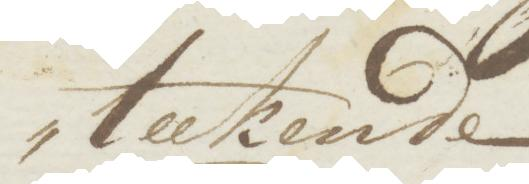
„teekende
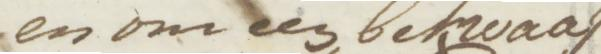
en om een bekwaa
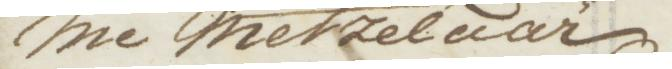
me metzelaar
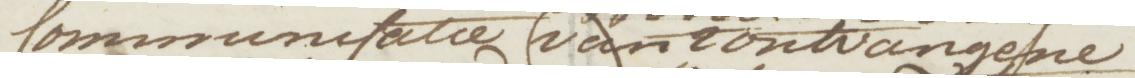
Communicatie van t ontvangene
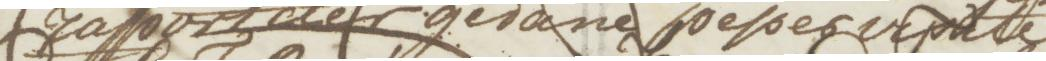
rapport der gedane peper visite
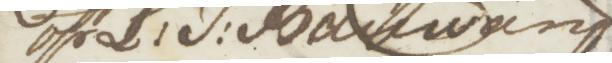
op L: T: Bauwang
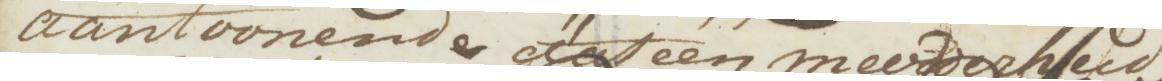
aantoonende datneen meerderheid
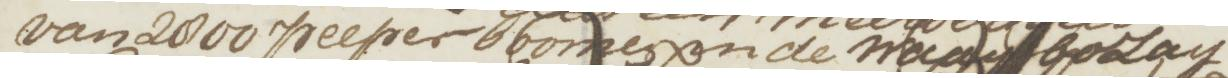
van 2800 peeper boomen in de waarbozaij
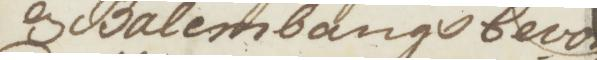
en Balembangs bevon
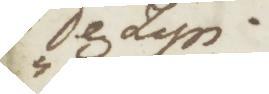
„den zyn.
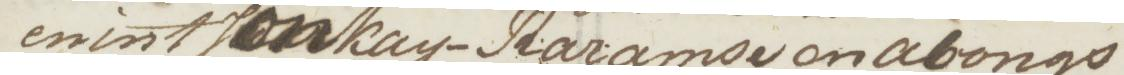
en int Jonkaij-Raramse en abongs
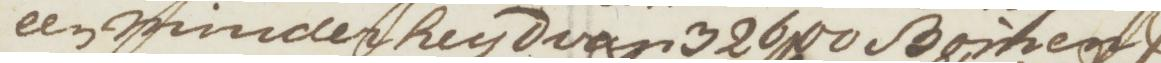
een minderheyd van 32600 Bomen
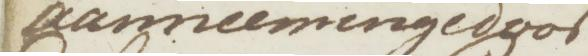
aanneeminge door
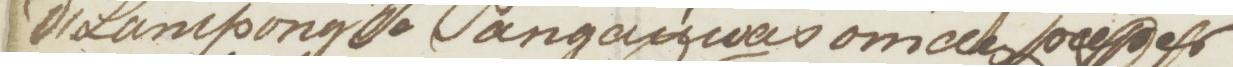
d'Lampongse Pangauwas om den peeper
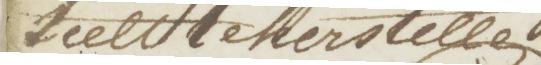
teelt te herstellen
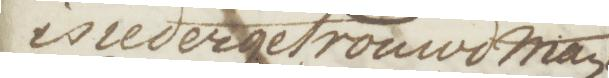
is ieder getrouwd man
